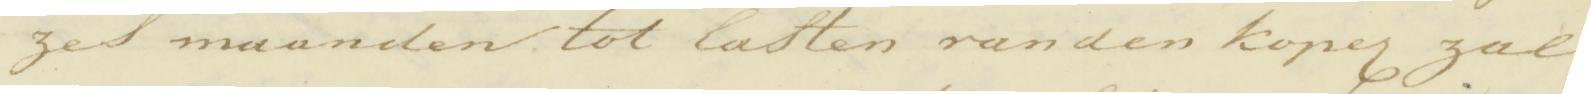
zes maanden tot lasten van den koper zal
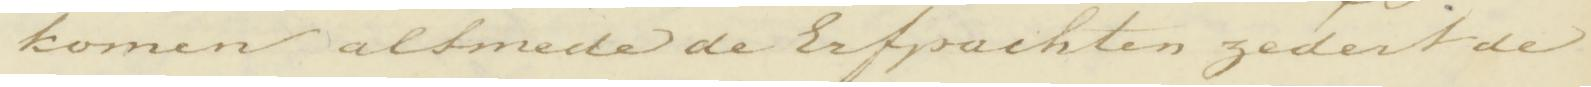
komen alsmede de Erfpachten zedert de
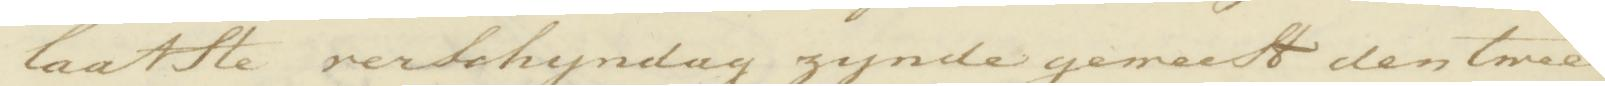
laatste verschyndag zynde geweest den twee
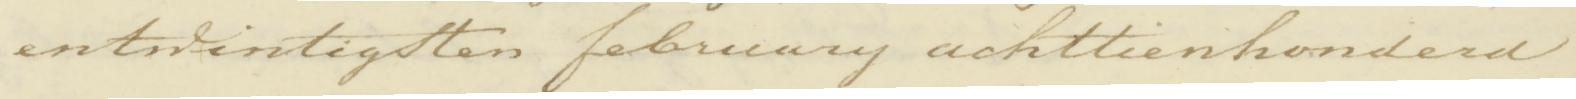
en twintigsten february achttien honderd
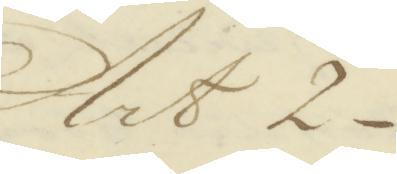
Art 2—
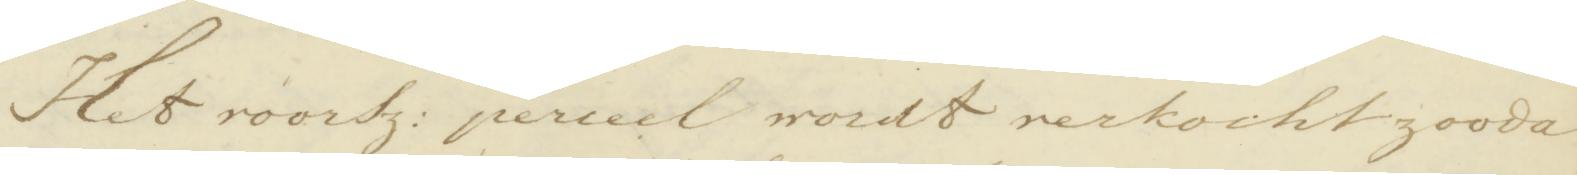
Het voorsz: perceel wordt verkocht zooda
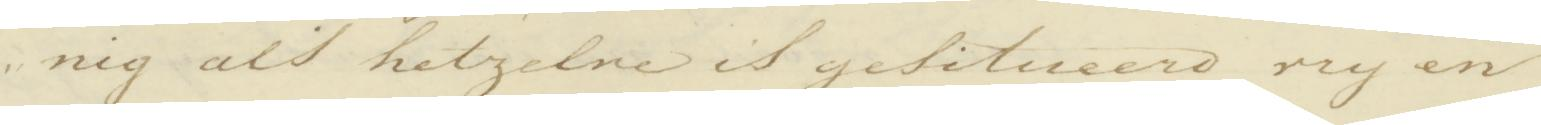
„nig als hetzelve is gesitueerd vry en
